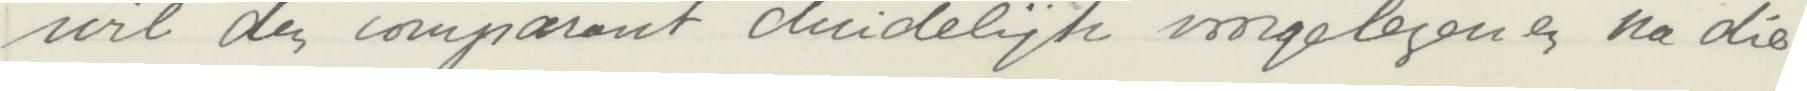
wil den comparent duidelijk voorgelezen en na die
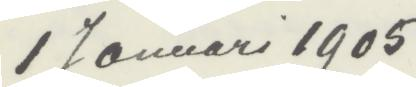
1 Januari 1905
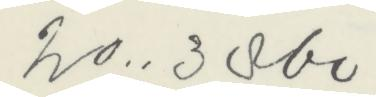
No„ 3860
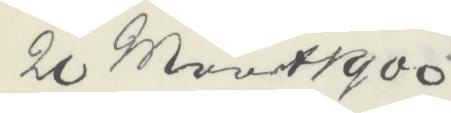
20 Maart 1900
